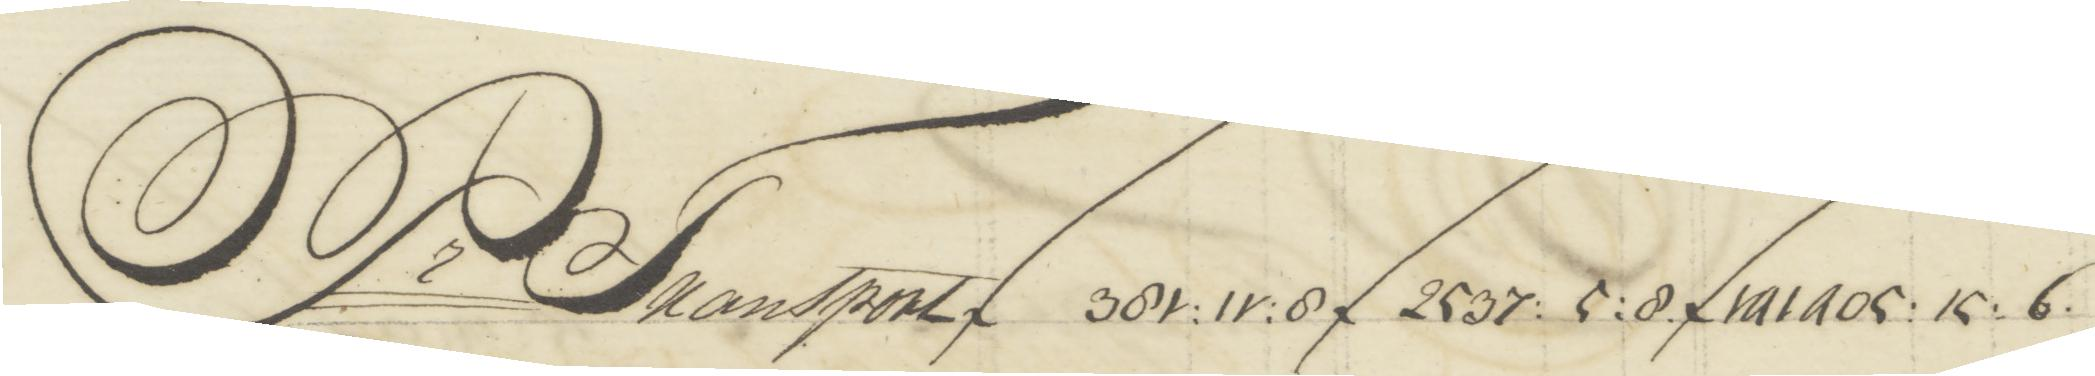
P=r Transport ƒ 381:11:8 ƒ 2537: 5: 8. ƒ141405: 15: 6.
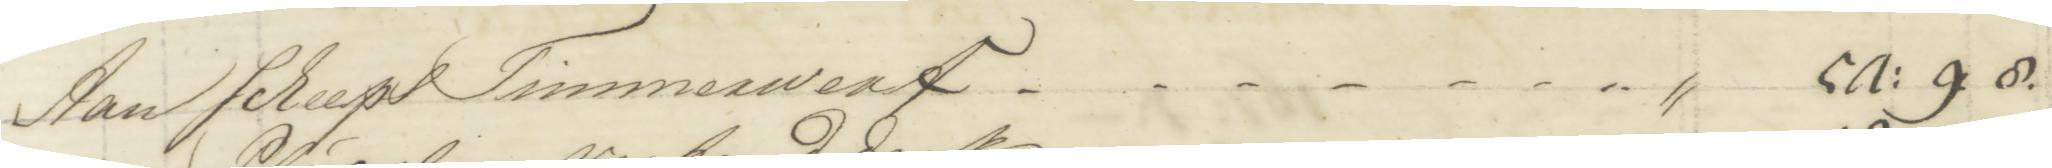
Aan scheeps Timmerwerf – – – – – – – „ 54: 9: 8.
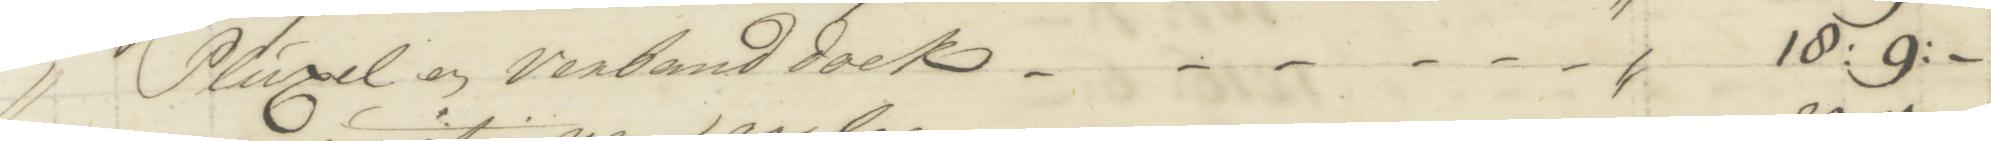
„ Pluxel en verband doek – – – – – – „ 18: 9: –
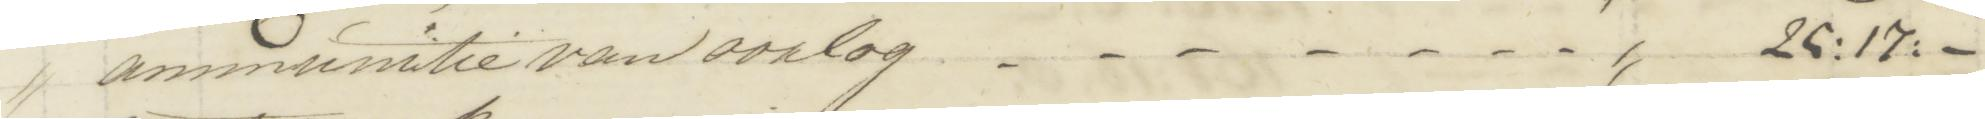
„ ammunitie van oorlog – – – – – – – „ 25: 17: –
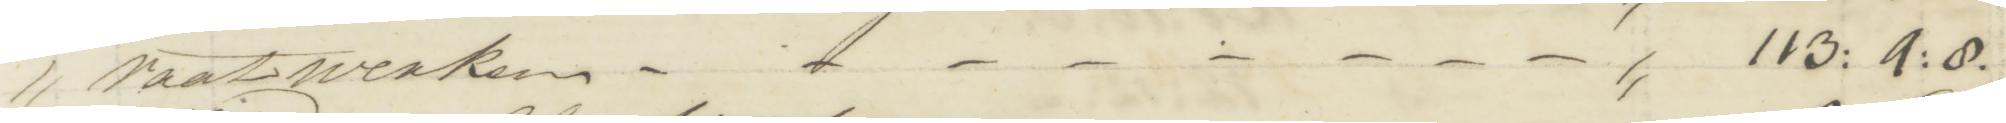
„ vaat werken – – – – – – – – „ 113: 4: 8.
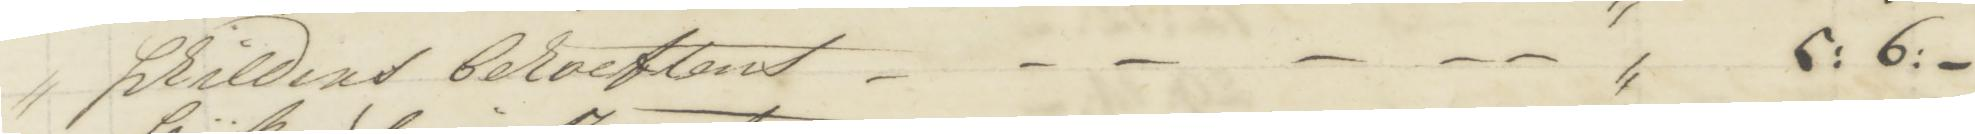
„ schilders behoeftens – – — — — — „ 5: 6: –
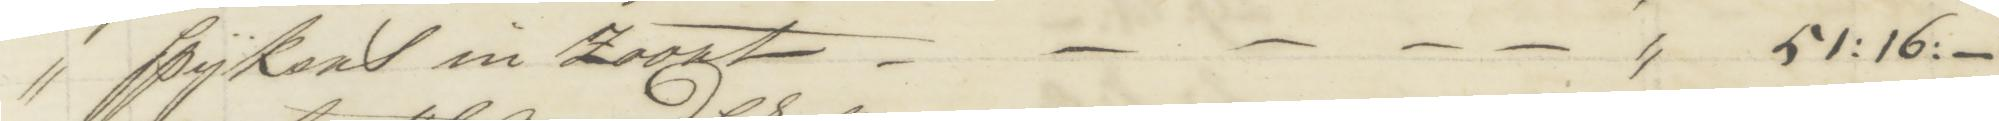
„ spijkers in zoort – — — — — „ 51: 16: –
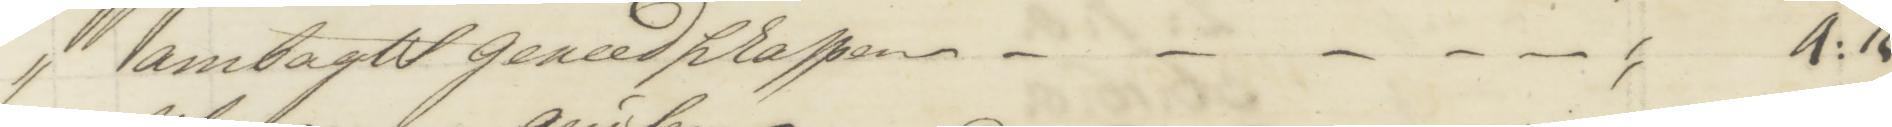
„ ambagts gereedschappen „ – — — — — 4: 15: –
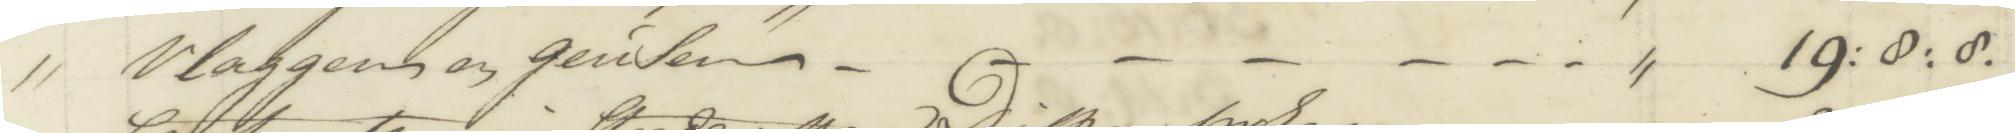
„ vlaggen en geusen – – — — — — – „ 19: 8: 8.
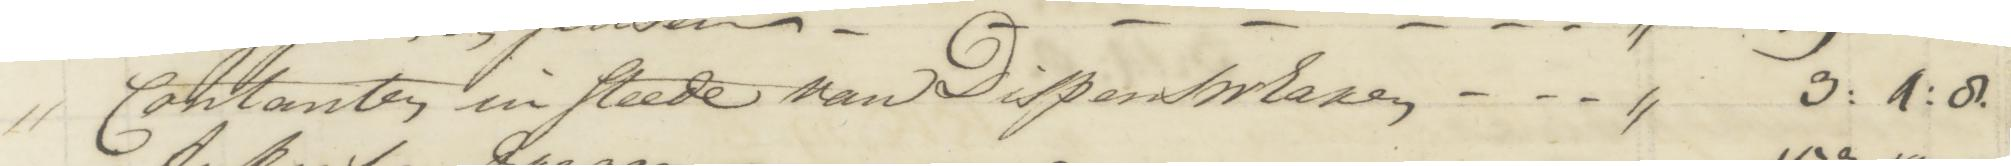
„ Contanten in steede van Dispenswharen – – – „ 3: 4: 8.
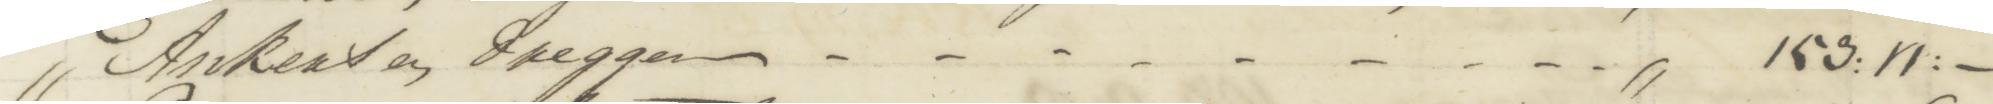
„ Ankers en dreggen – – – – – – – – – „ 153: 11: –
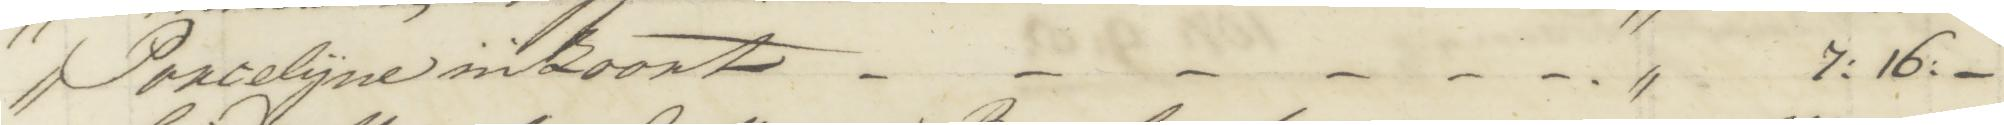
„ Porcelijne in zoort – — — — – – - „ 7: 16: —
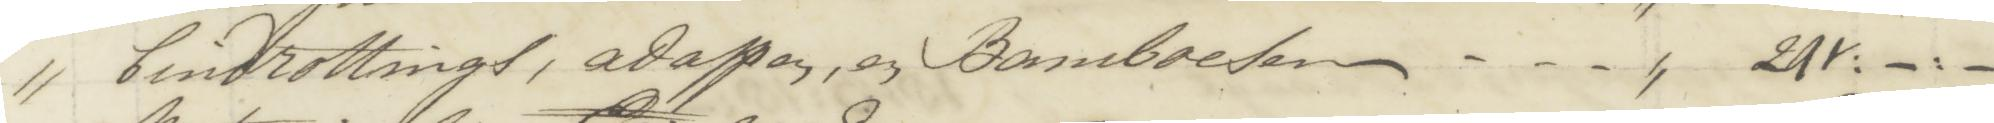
„ bindrottings, adappen, en Bamboesen – – – „ 241: – : –
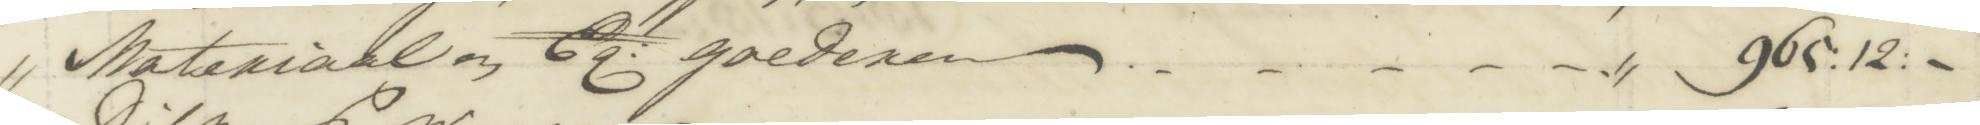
„ Materiaal en Eq: goederen . - – – – – .„ 965: 12: –
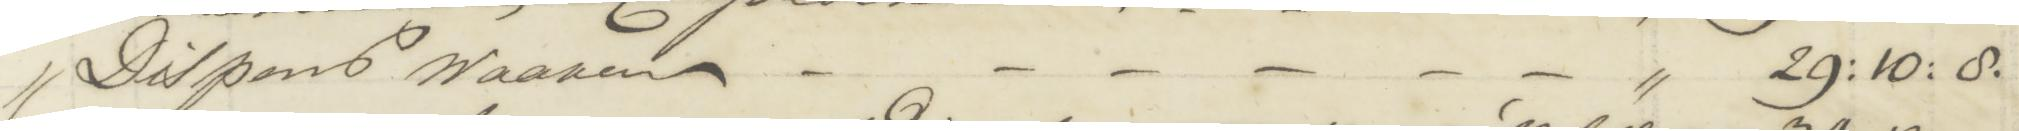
„ Dispens waaren – – — — — — „ 29: 10: 8.
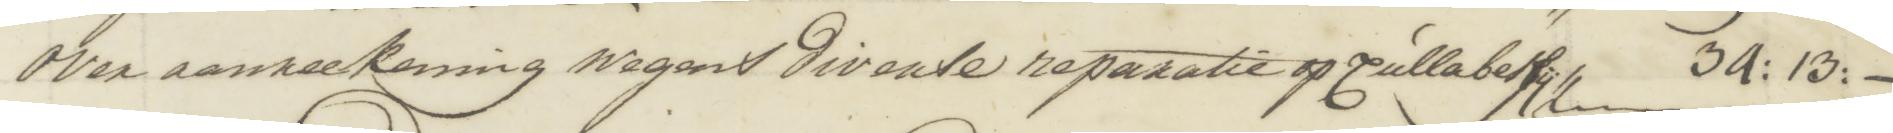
over aanreekening wegens diverse reparatie op xullabessij „ 34: 13: –
